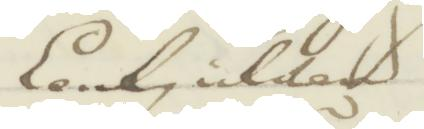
EenGulden
